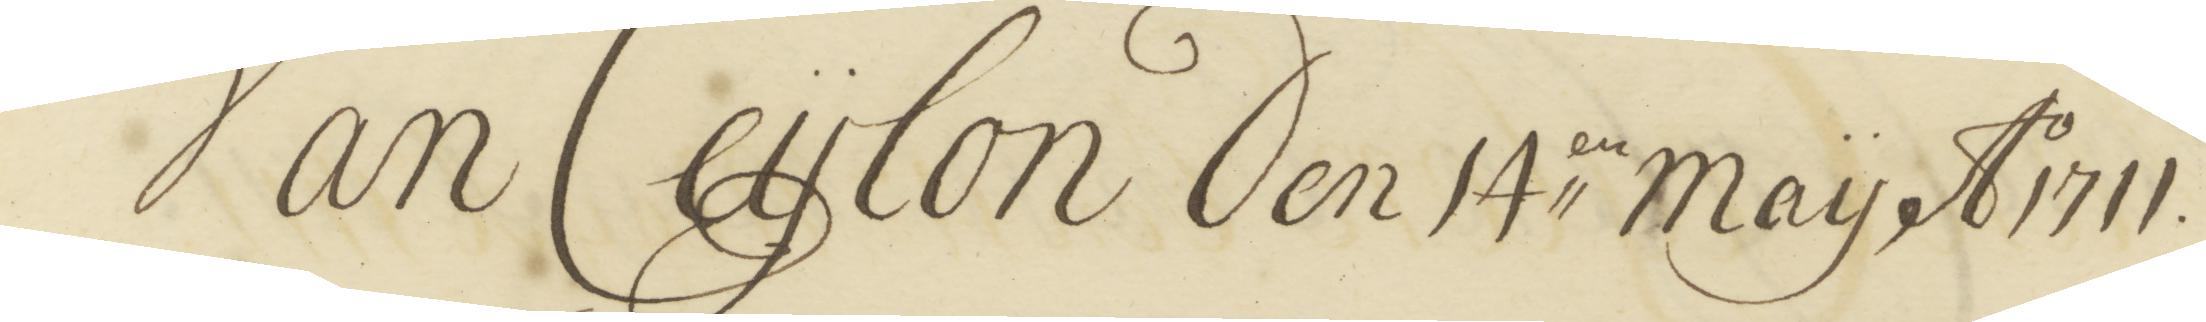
Van Ceijlon den 14„en Maij Ao 1711.
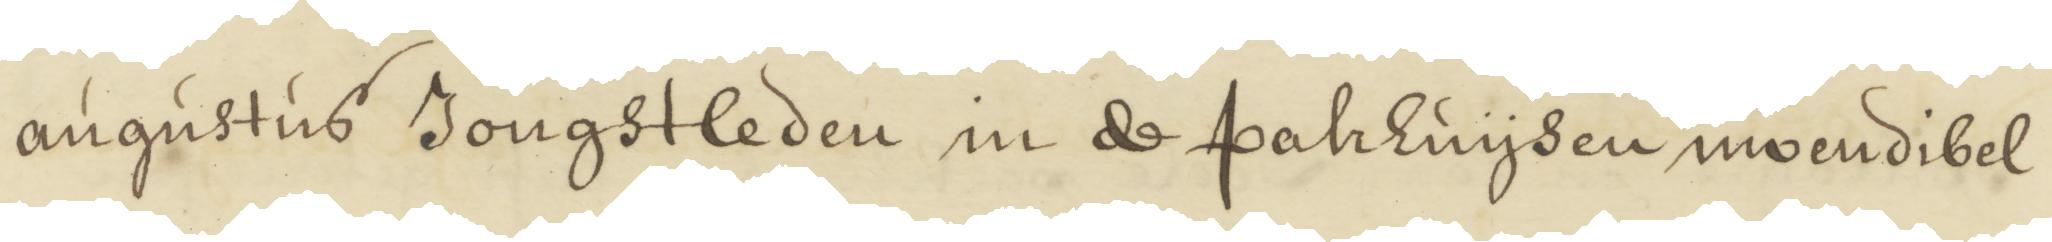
augustus Iongstleden in de pakhuijsen invendibel
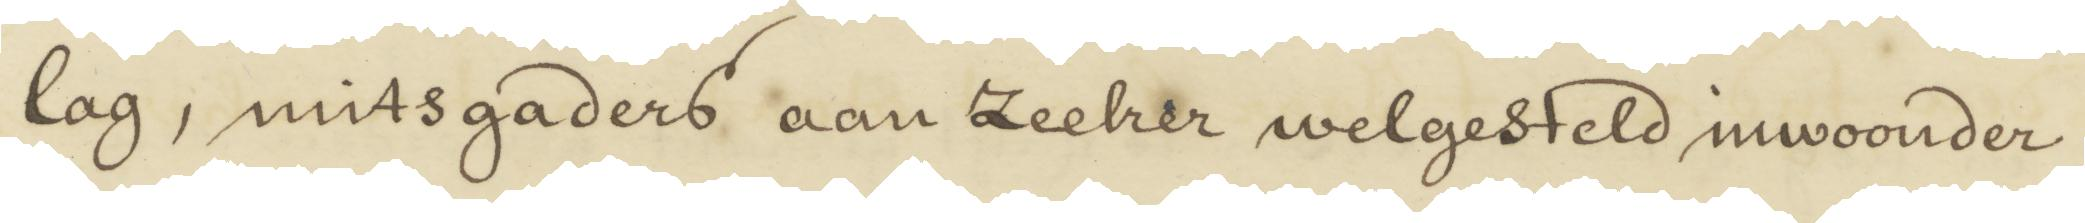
lag, mitsgaders aan zeeker welgesteld inwoonder
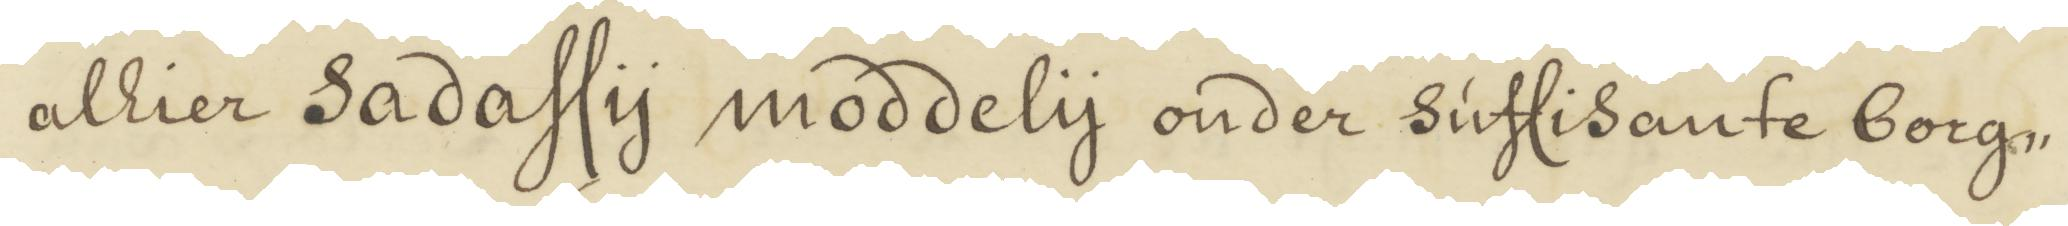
alhier sadassij moddelij onder suffisante borg„
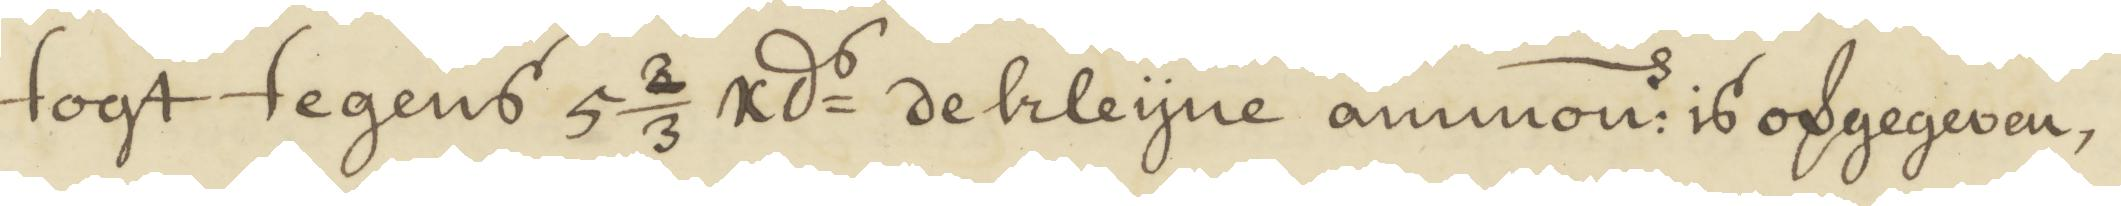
togt tegens 5 2/3 rd=s de kleijne ammon:s is overgegeven,
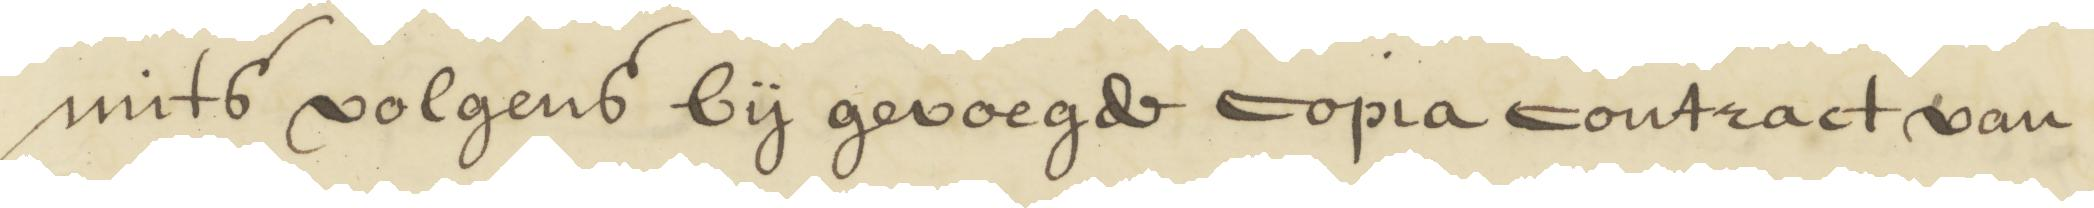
mits volgens bij gevoegde copia contract van
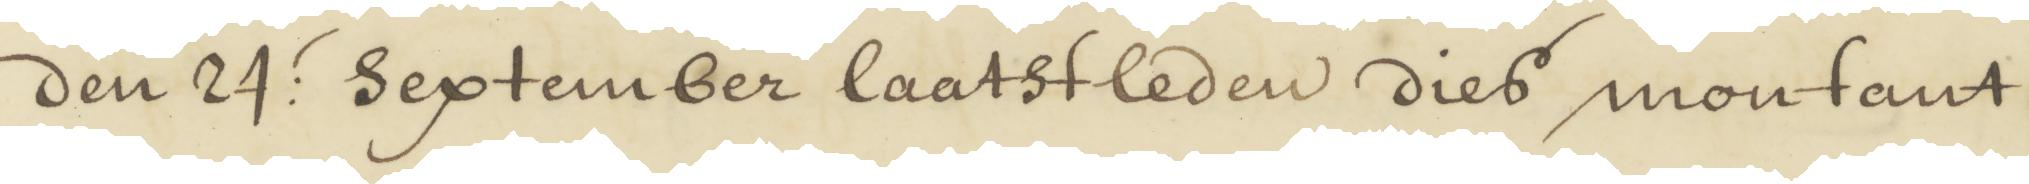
den 24:' september laatstleden dies montant
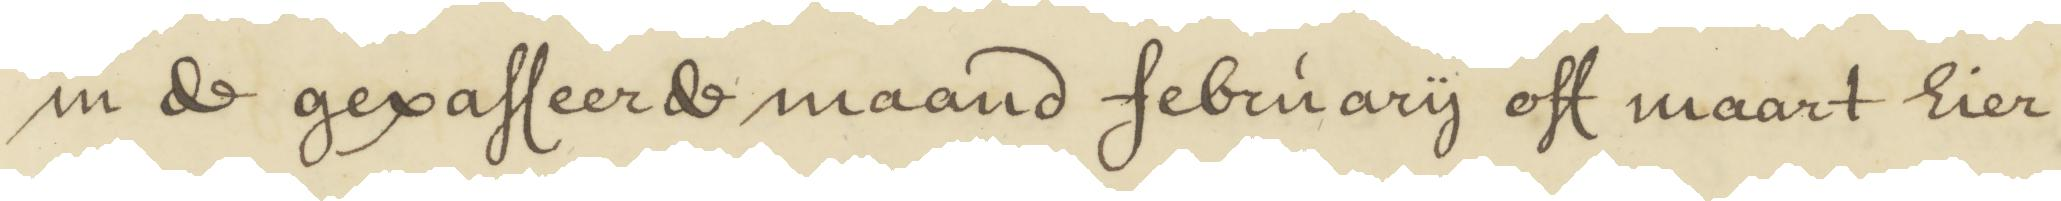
in de gepasseerde maand februarij off maart hier
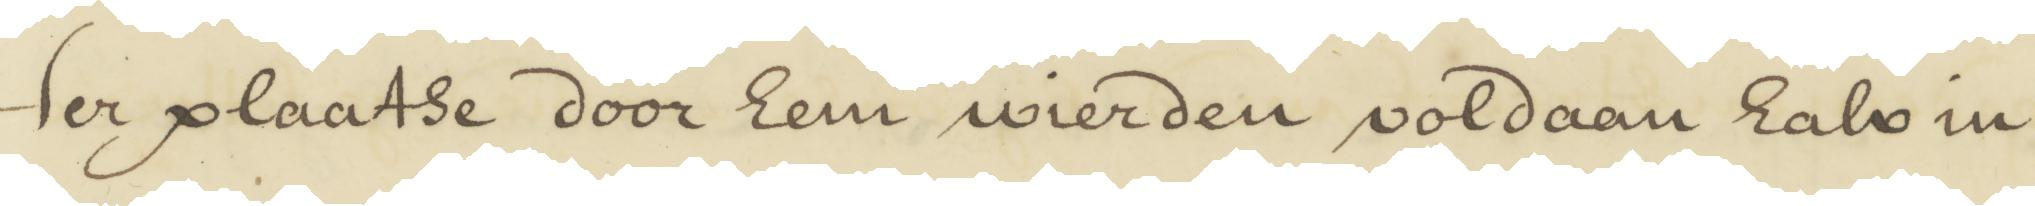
ter plaatse door hem wierden voldaan halv in
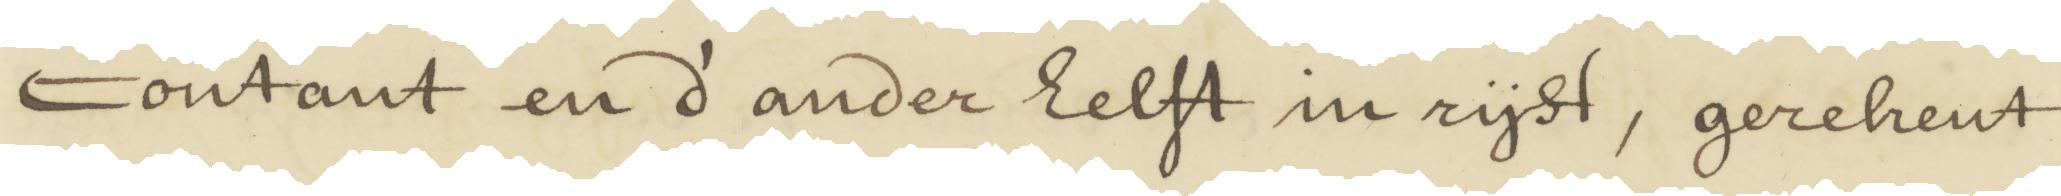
contant en d' ander helft in rijst, gerekent
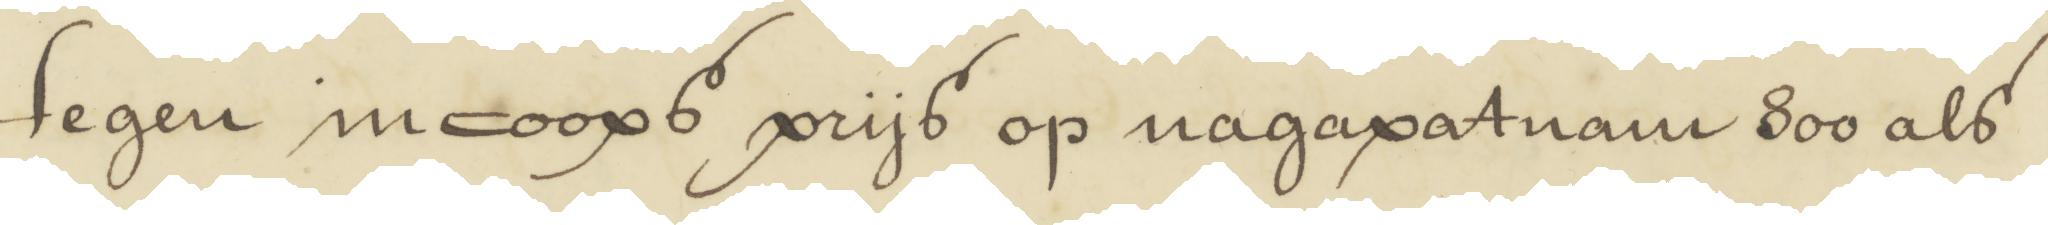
tegen incoops prijs op nagapatnam soo als
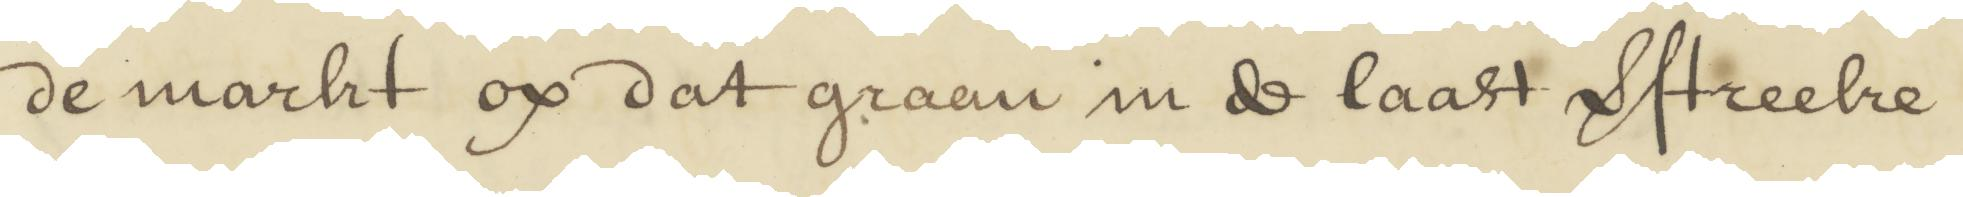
de markt op dat graan in de laast verstreeke
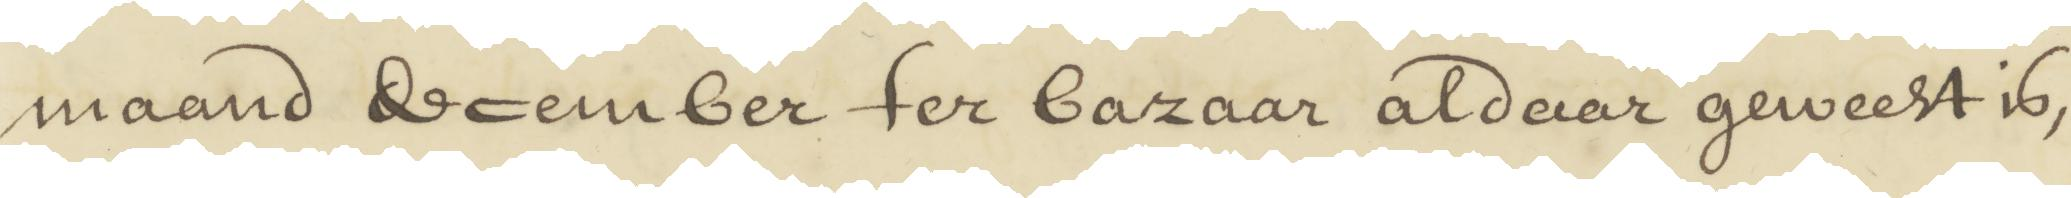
maand december ter bazaar aldaar geweest is,
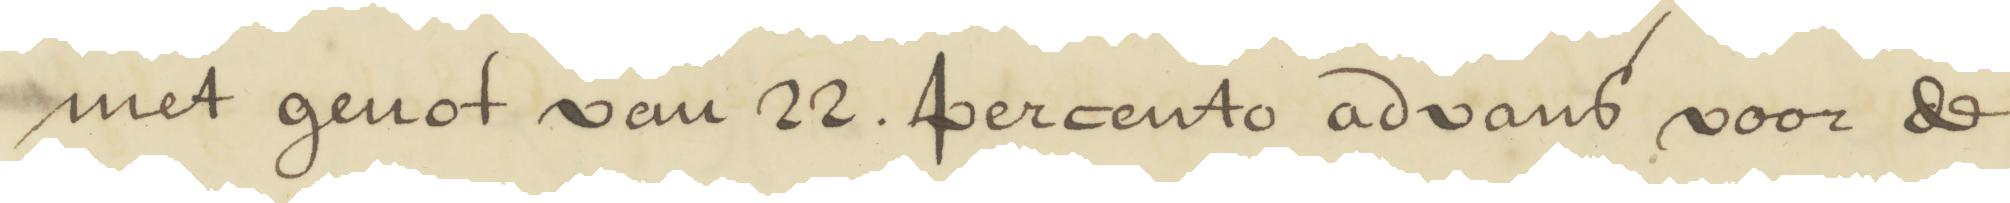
met genot van 22. percento advans voor de
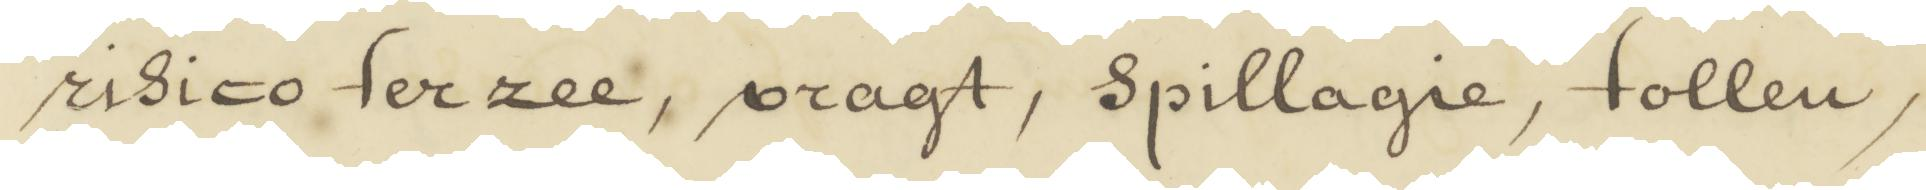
risico ter zee, vragt, spillagie, tollen,
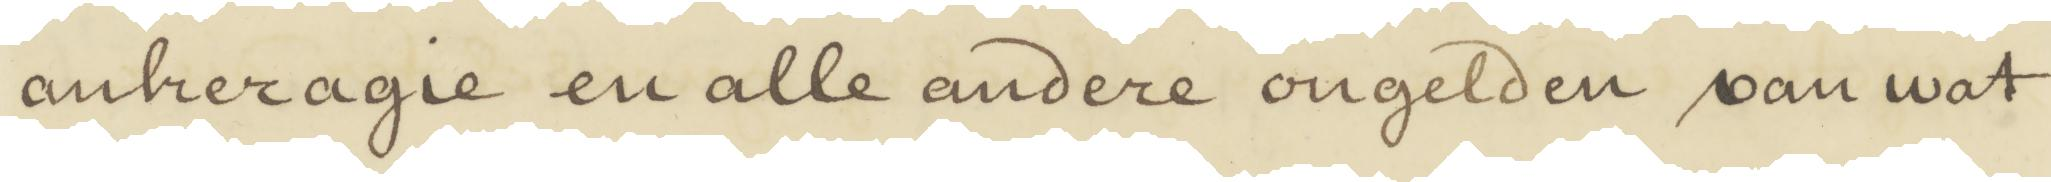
ankeragie en alle andere ongelden van wat
